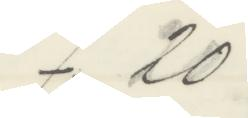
ƒ 20
